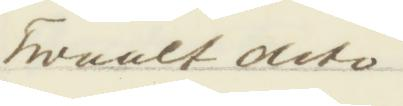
Twaalf dito
